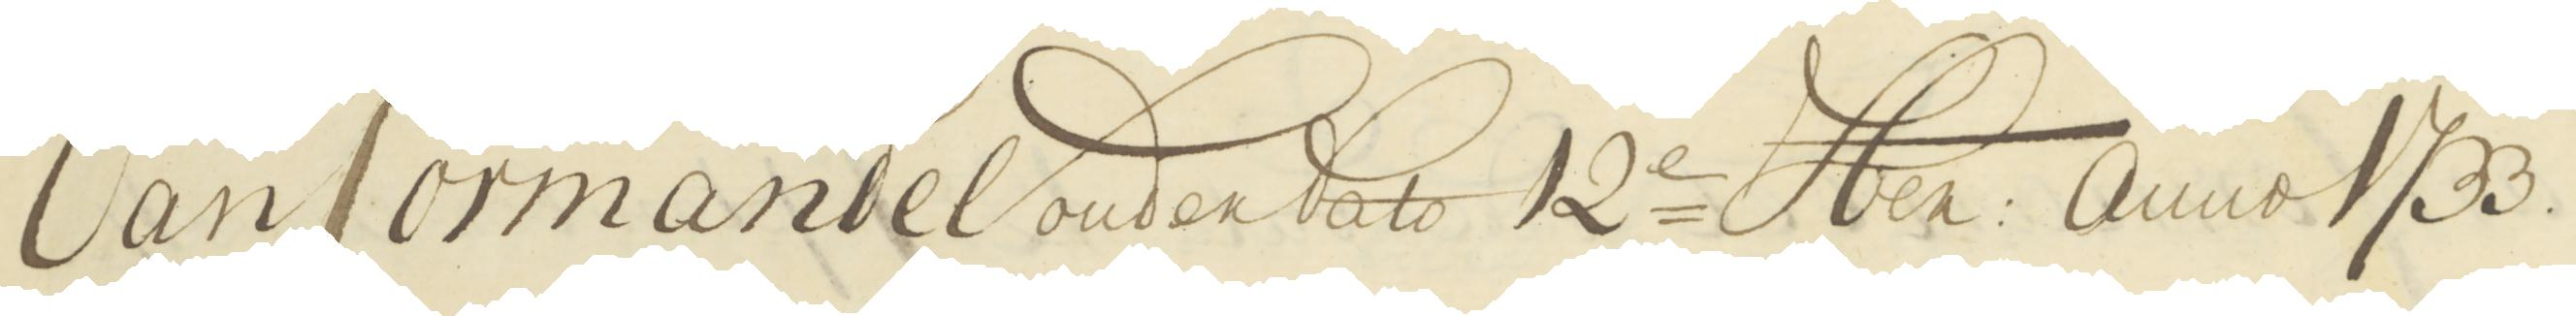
Van Cormandel onderdato 12=e 7ber: Anno1733.
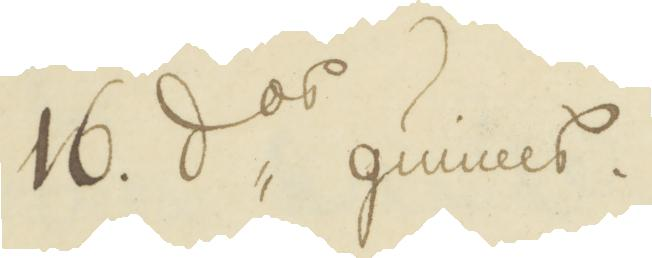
16. d„os guinees.
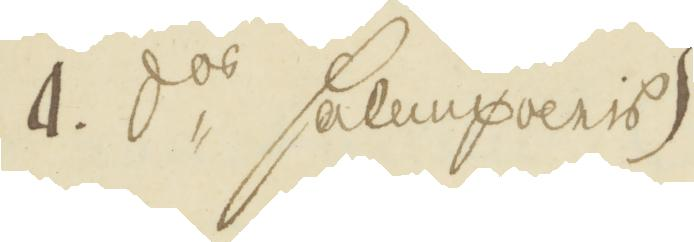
4. d„os salempoeris
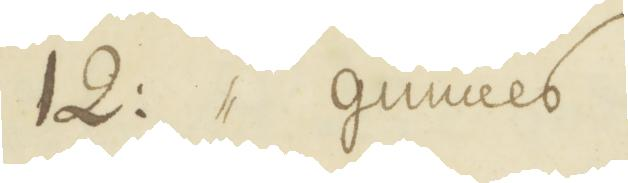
12: „ guinees
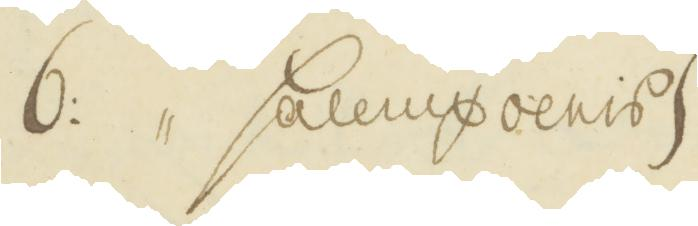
6: „ salempoeris
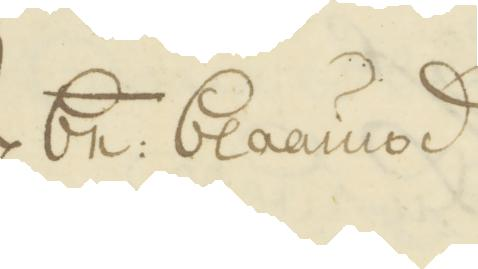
br: blaauwe
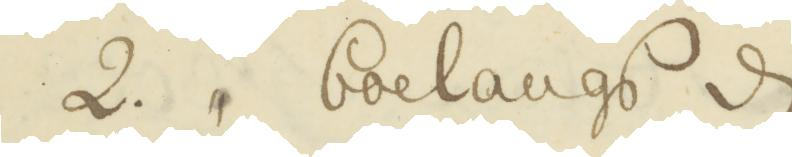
2. „ boelangs en
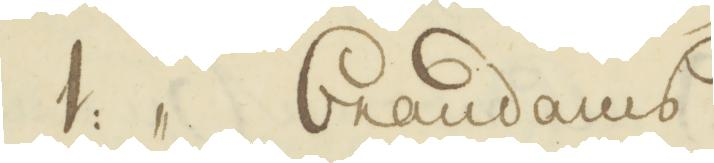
1: „ brandams
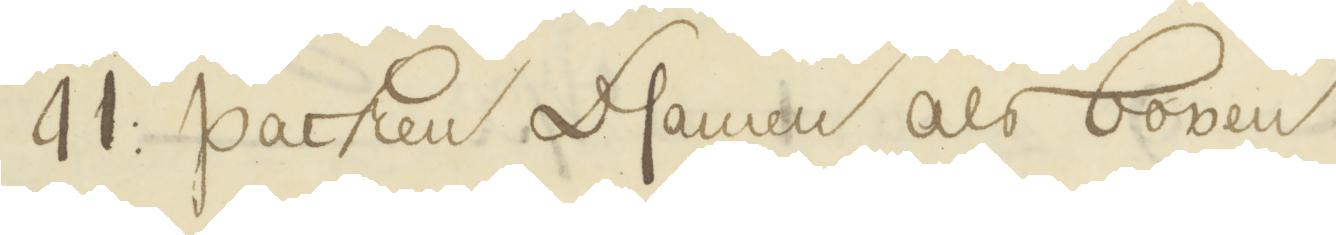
41: packen tesamen als boven
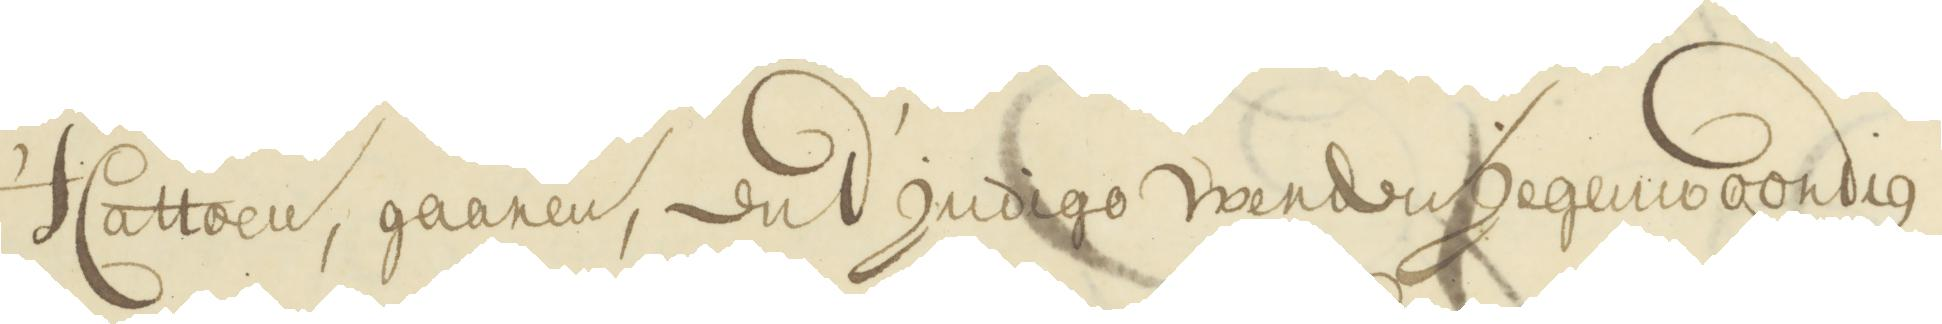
't Cattoen, gaaren, en d’jndigo werden tegenwoordig
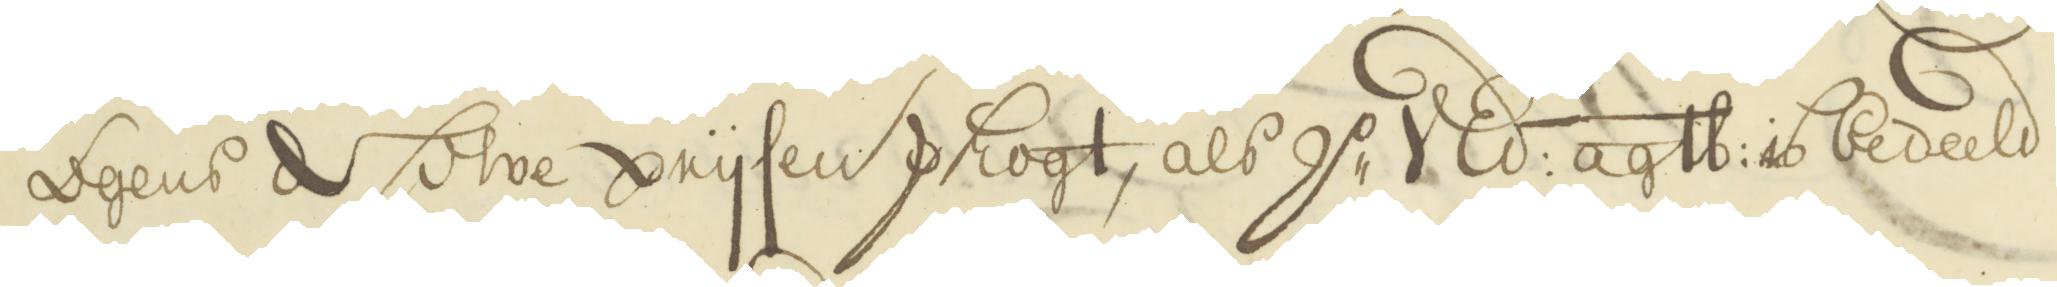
tegens deselve prijsen verkogt, als j„o VEd: agtb: is bedeeld
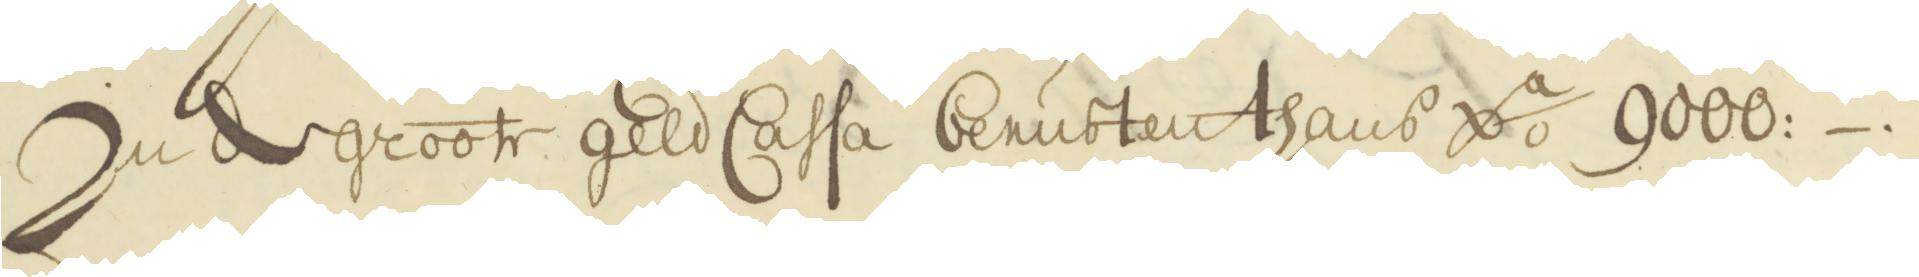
jn de groote geld Cassa berusten thans p a/o 9000:—.
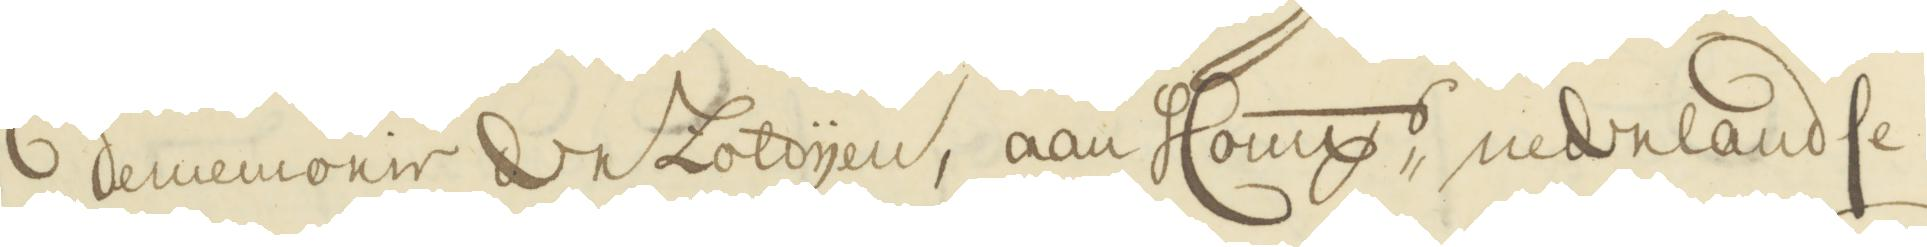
dememorie der zoldijen, aan sComp„s nederlandse
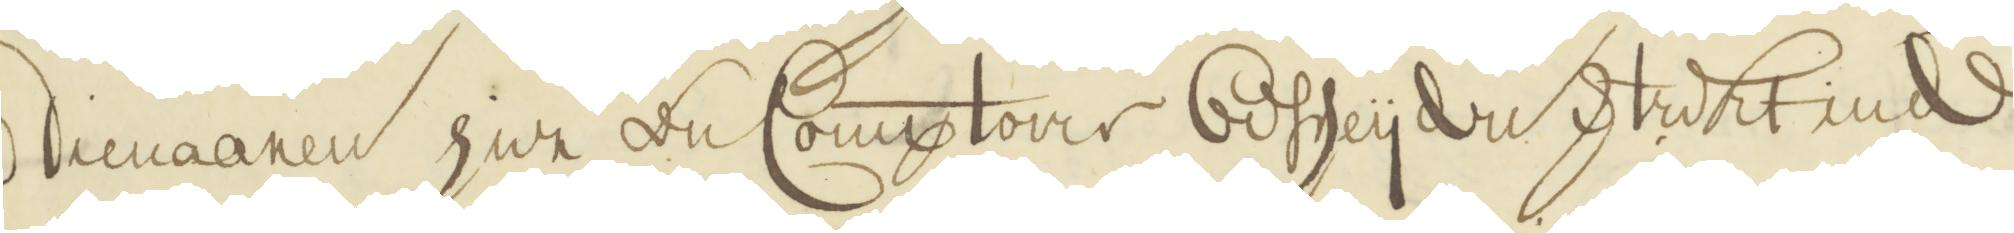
dienaaren hier ten Comptoire bescheijden vertrekt in de
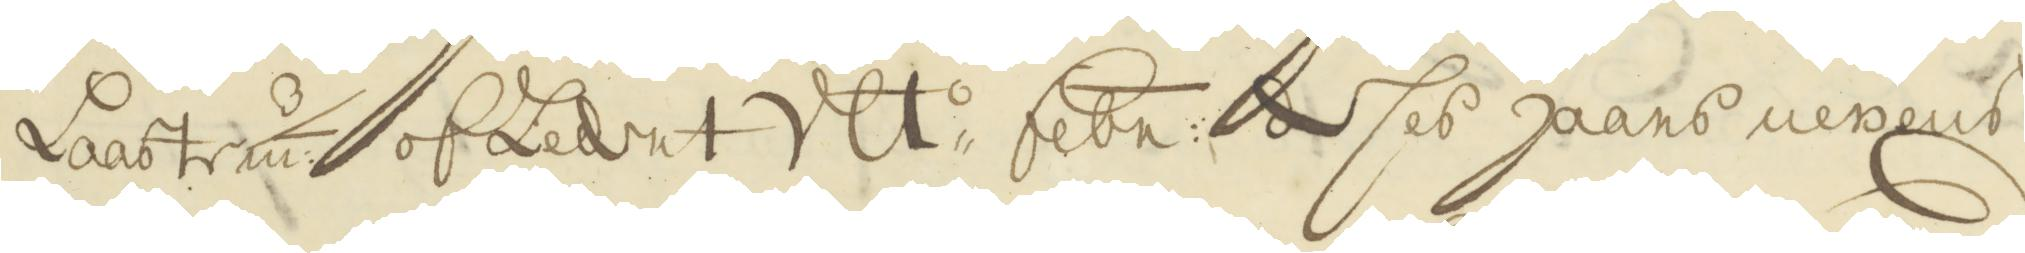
Laaste m: of zedert Vlt„o febr: deses Jaars nevens
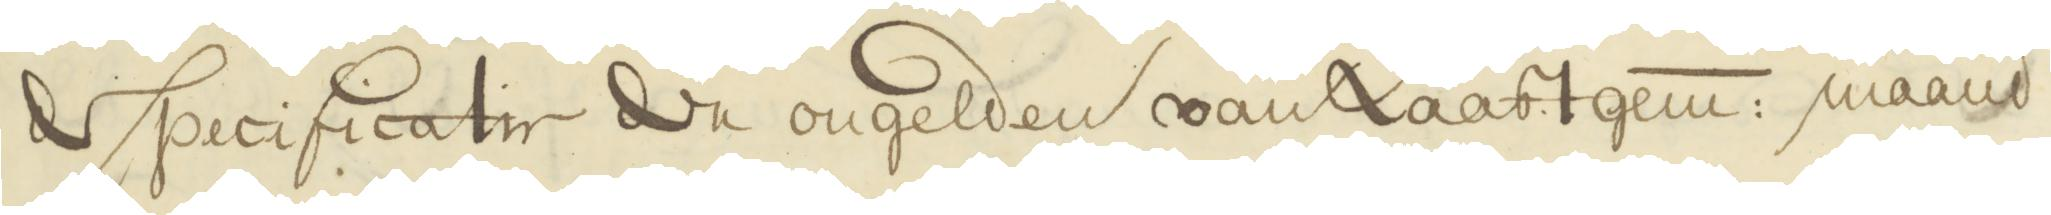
de specificatie der ongelden van Laast gem: maand
